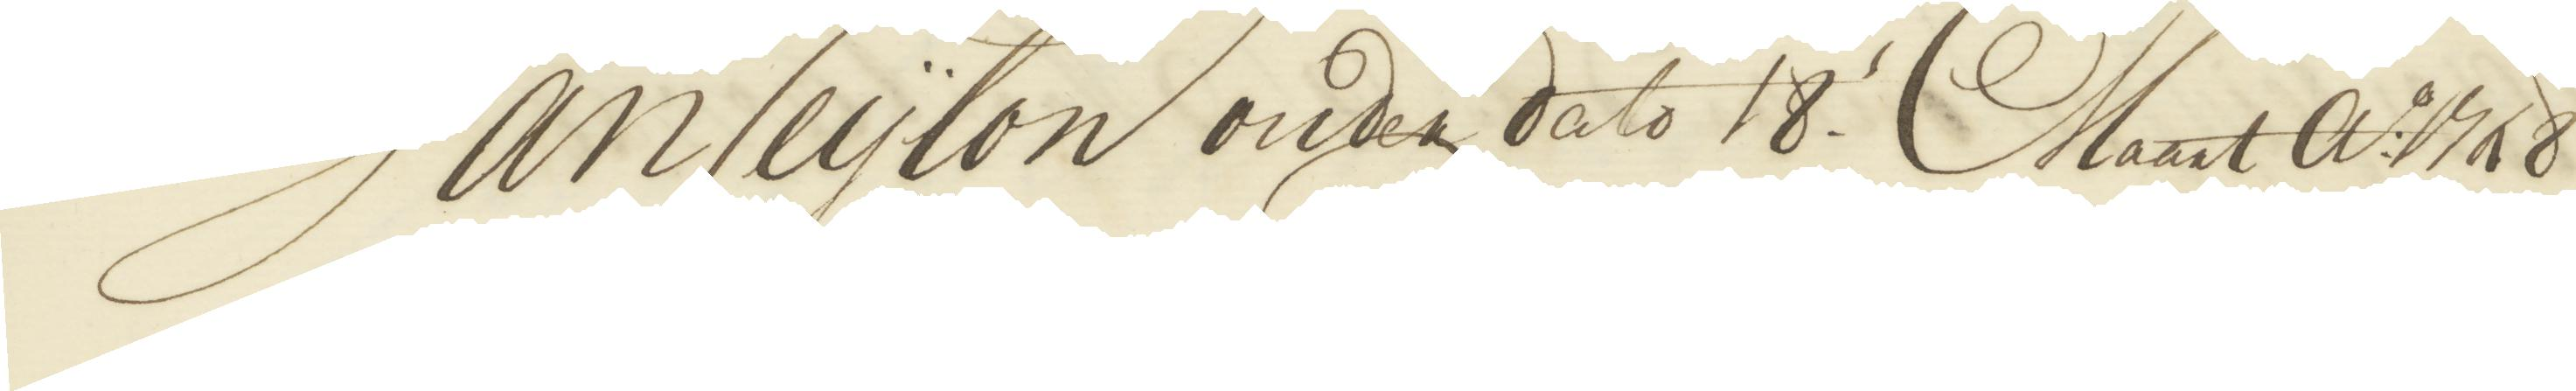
Van Ceijlon onder dato 18-' Maart a:o 1748
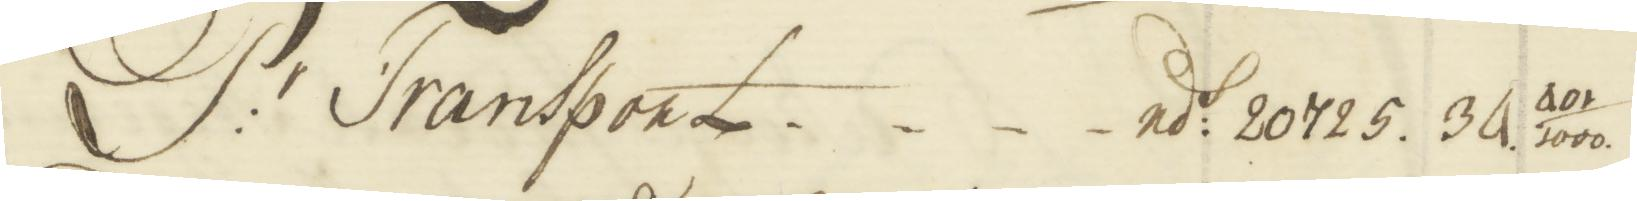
P:r Transport - - - - rd:s 20725. 34. 401/1000.
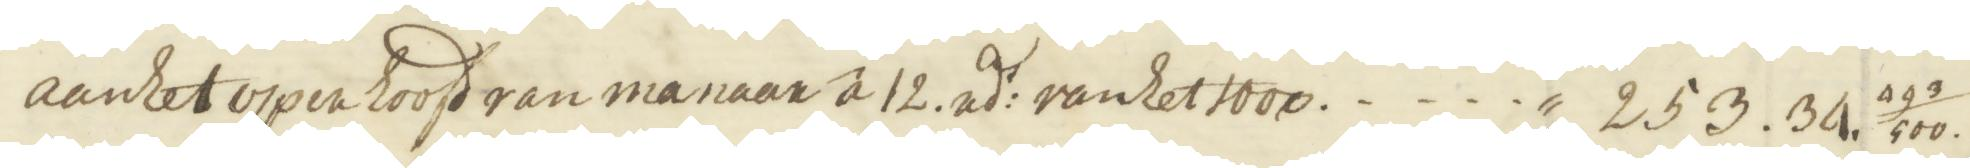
aan het opperhoofd van manaar â 12. rd:s van het 1000. - - - - „ 253. 34. 493/500
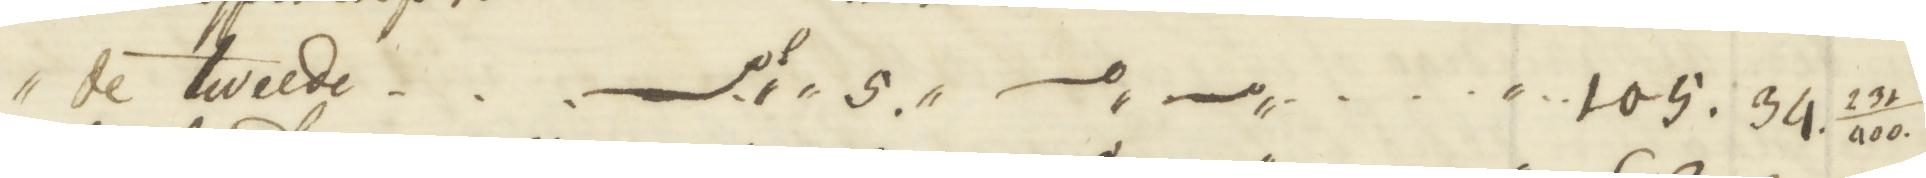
„ de tweede - - -_„o „ 5. „ _„o _„o - - - „ - - 105. 34. 231/400.
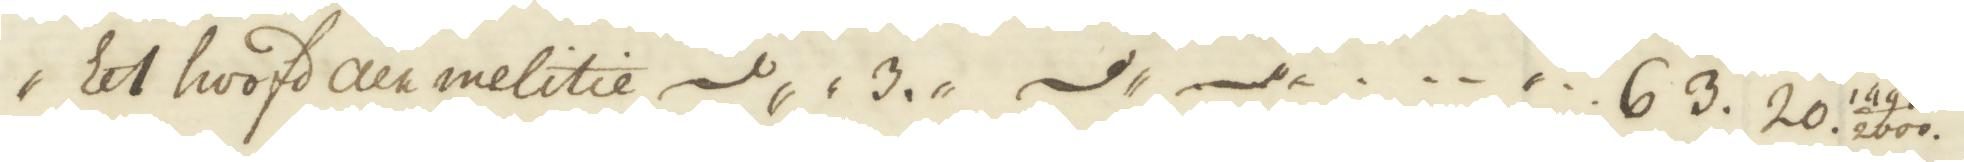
„ het hoofd der melitie _„o „ 3. „ _„o - - - „ - . 63. 20. 1493/2000.
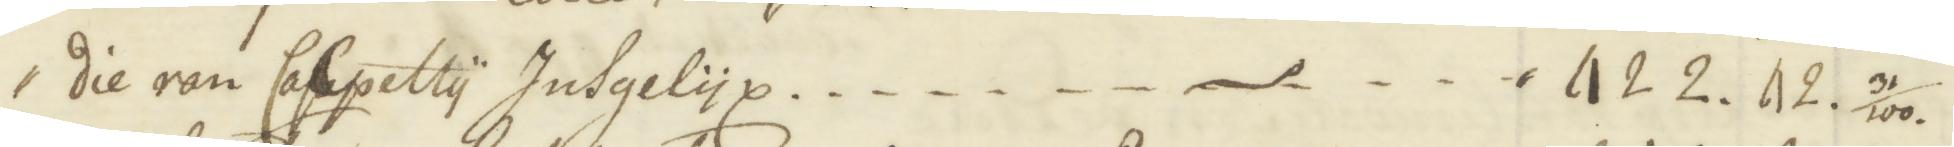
„ die van Calpettij Jnsgelijx . - - - - - _-o - - - „ 422. 42. 31/100.
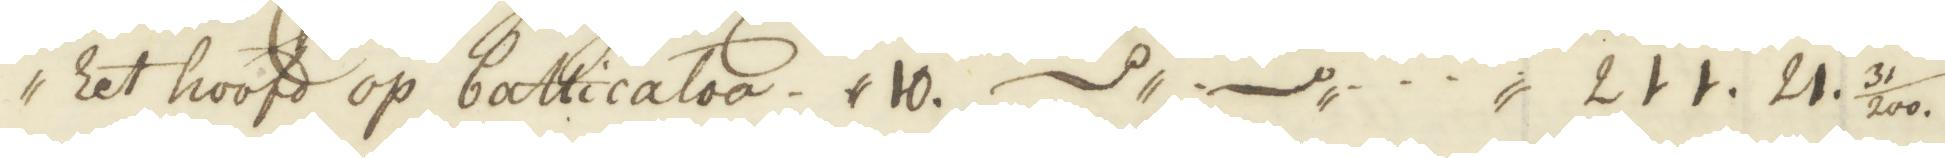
„ het hoofd op batticaloa - „ 10. _„o _„o - - - „. 211. 21. 31/200.
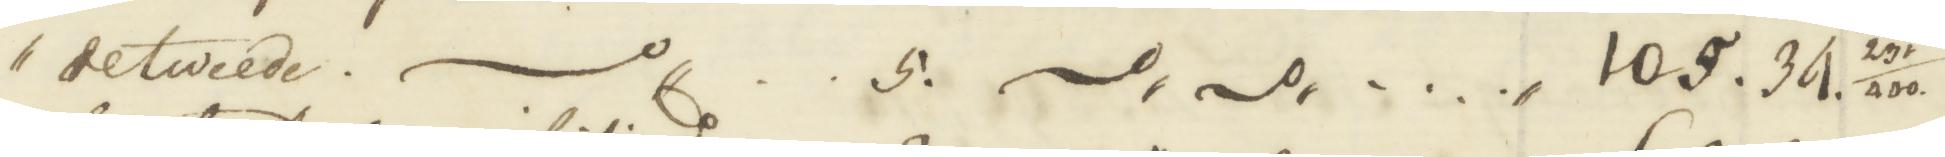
„ de tweede _„o . . 5. _„o _„o - . . . „ 105. 34. 231/400.
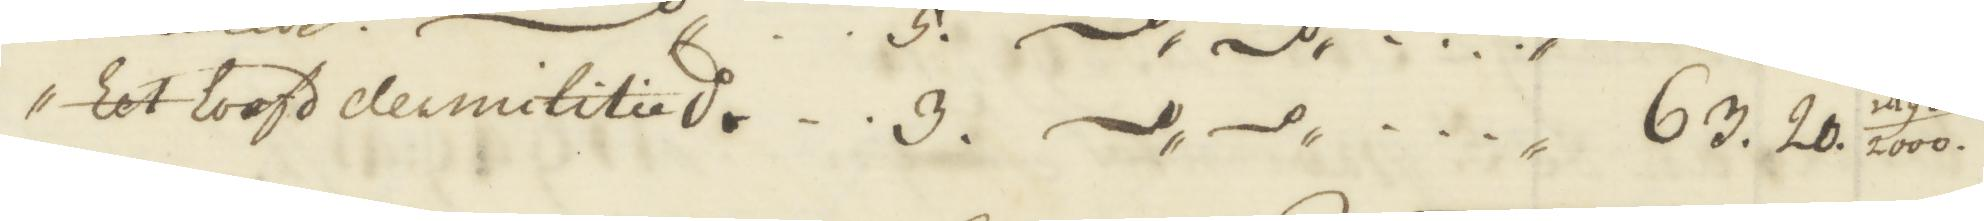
„ het hoofd dermilitie d-o - . 3. _„o _„o - - - „ 63. 20. 1493/2000.
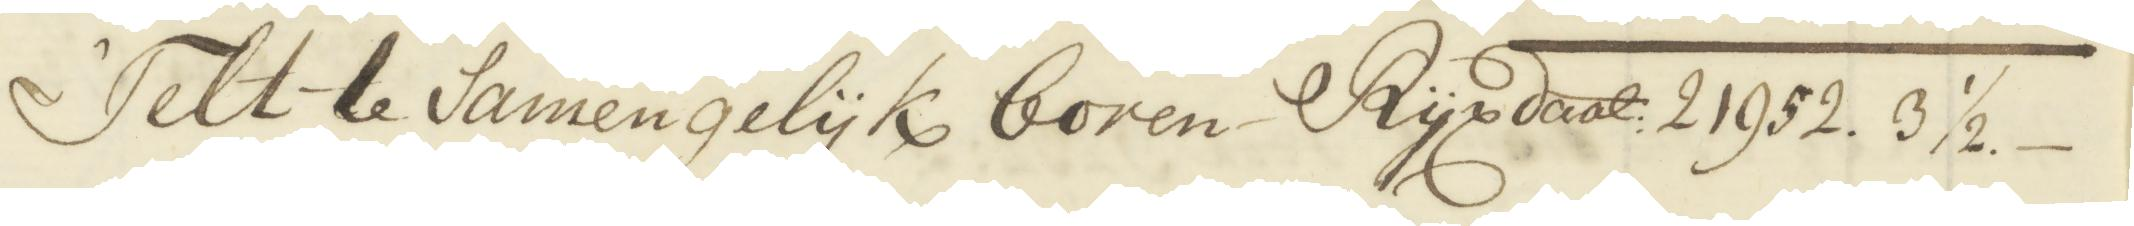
Telt te samen gelijk boven Rijxdaal: 21952. 3½. —
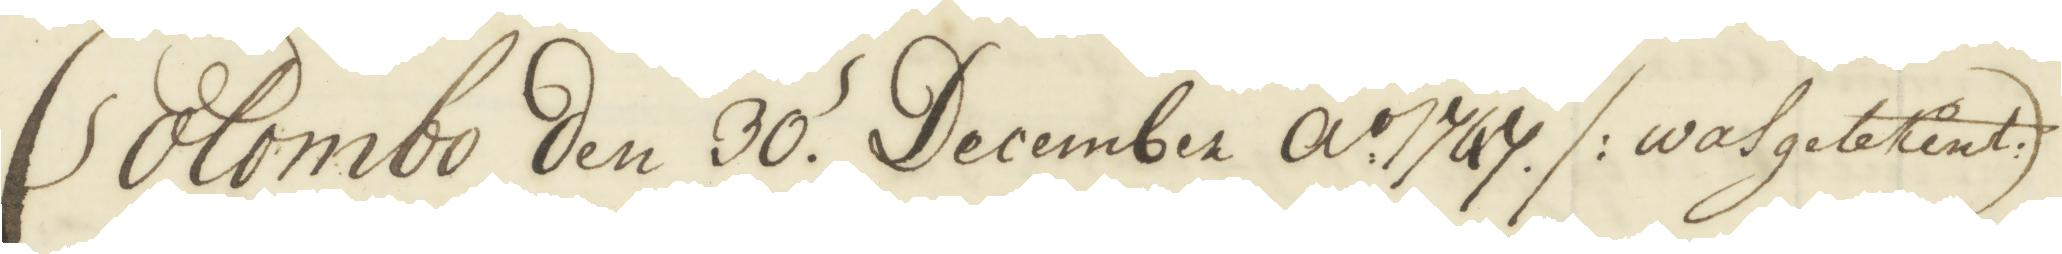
Colombo den 30.' December a:o 1747. /: was getekent:)
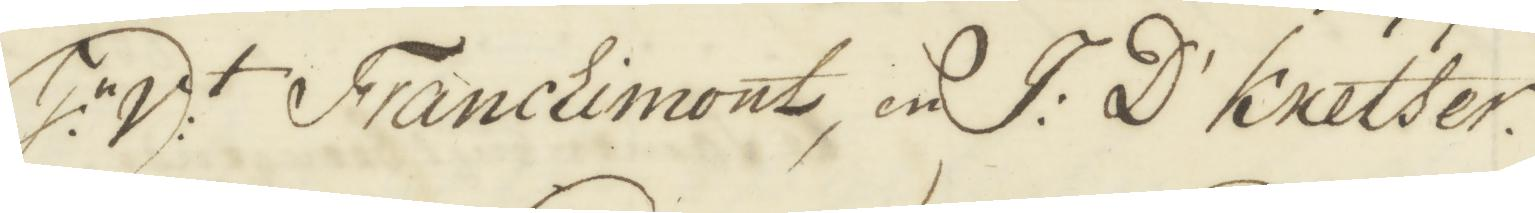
J:n V:t Franchimont, en I: D' Kretser.
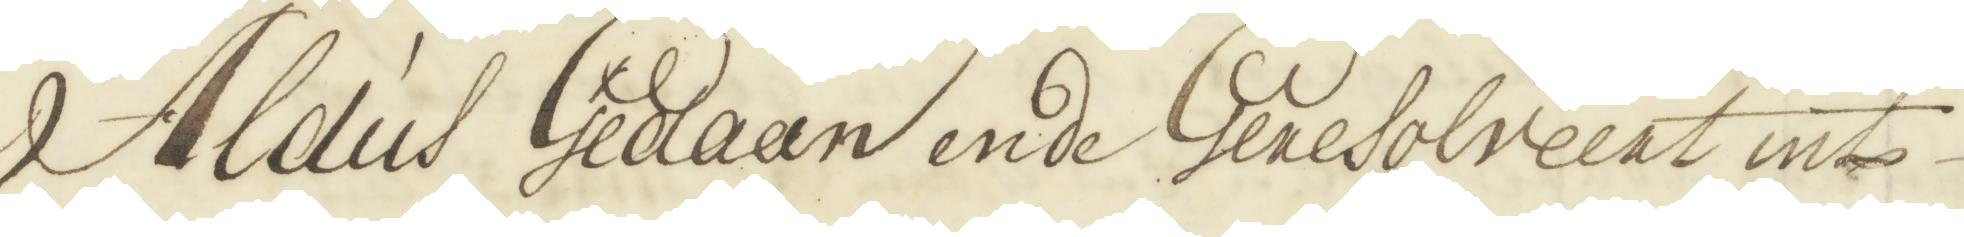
Aldus Gedaan ende Geresolveert in't
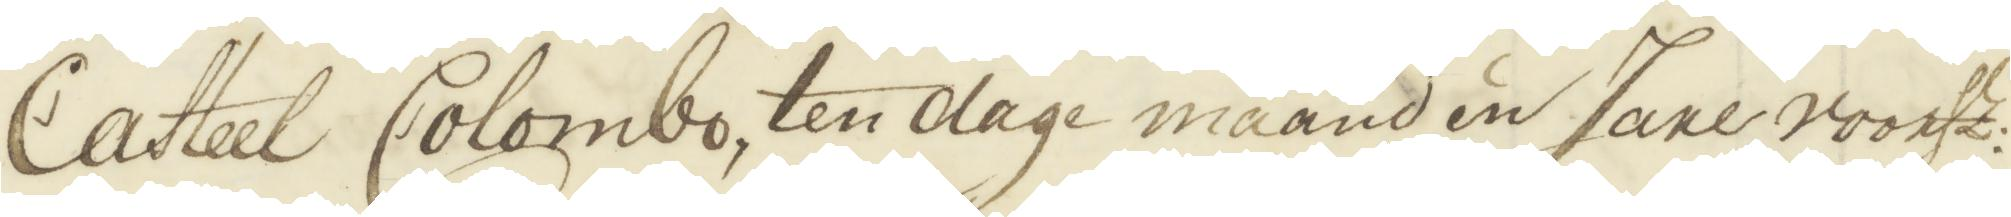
Casteel Colombo, ten dage maand en Jare voorsz
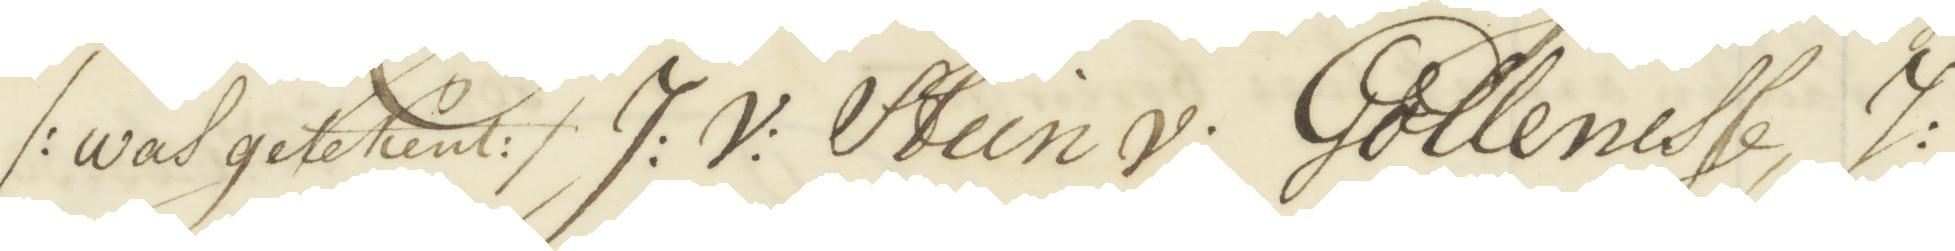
/: was getekent:/ J: V: Stein v: Gollenesse, J:
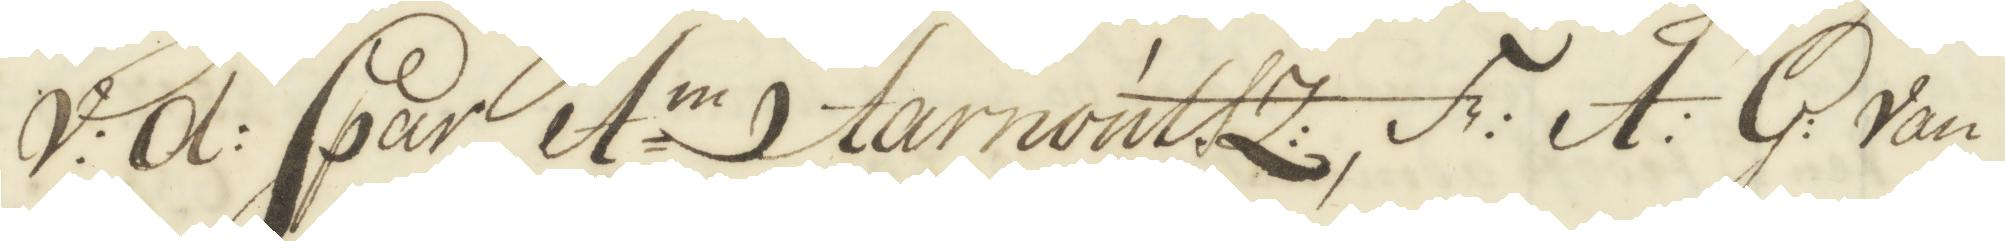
v: d: Spar, A=m Aarnoutsz:, F: A: G: van
